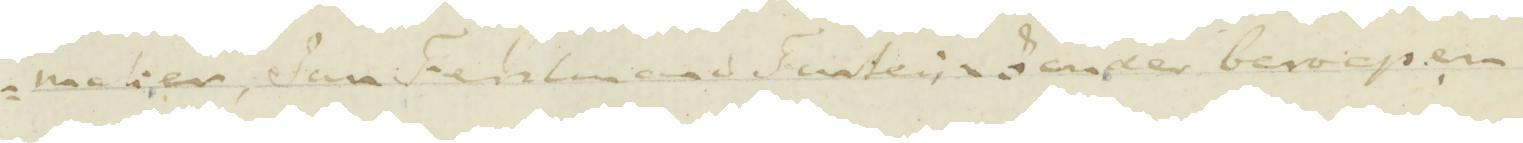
=maker, Ian Ferdinand Fonteijn zonder beroep, en
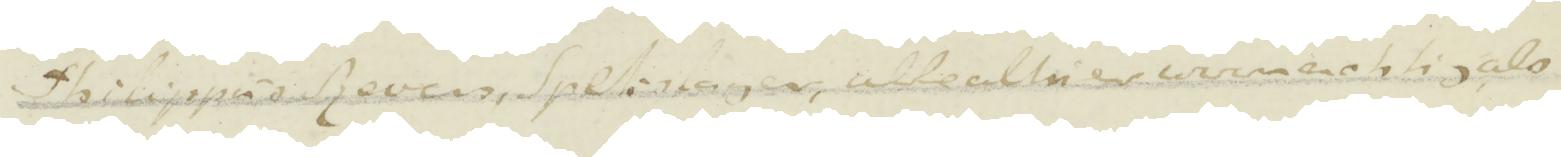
Philippus Revers, spekslager, alle alhier woonachtig, als
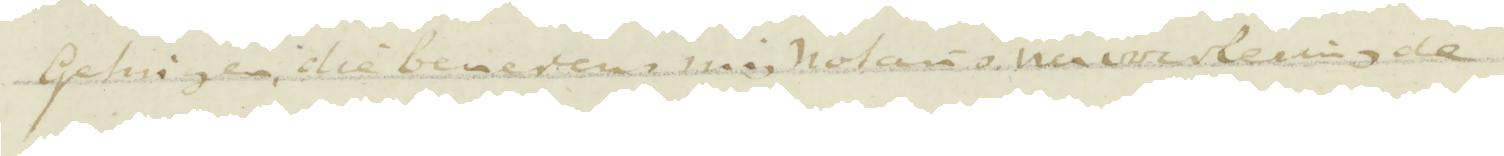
Getuigen, die benevens mij Notaris na voorlezing de
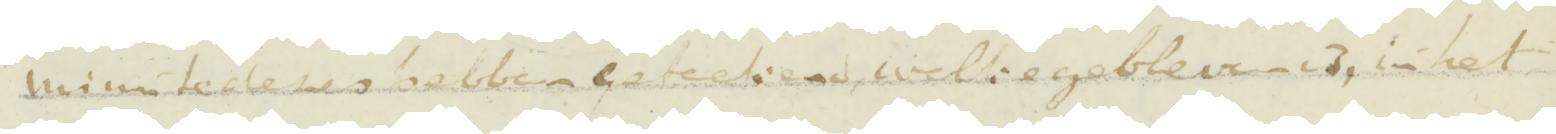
minute dezes hebben getekend, welke gebleven is, in het
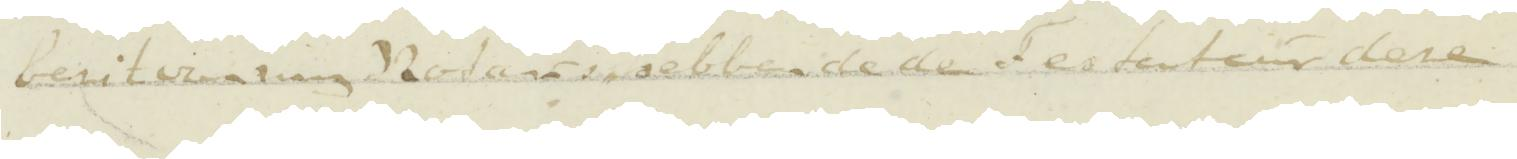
bezit van my Notaris, hebbende den Testateur deze
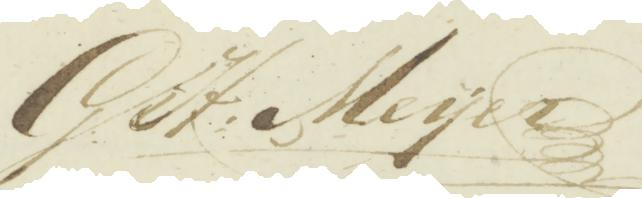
G. H: Meijer
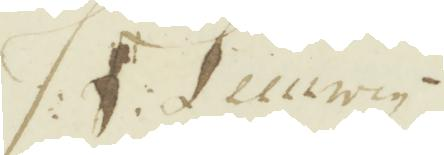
J: v: Leeuwen.
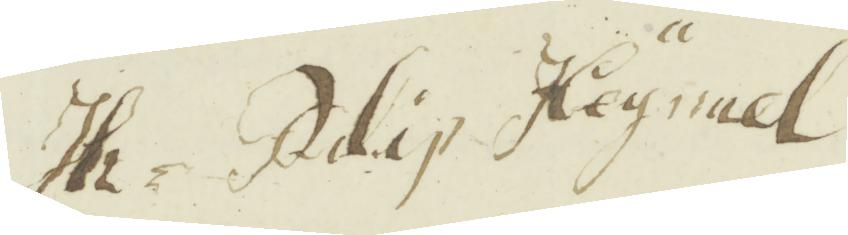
Is: Philip Heijmel
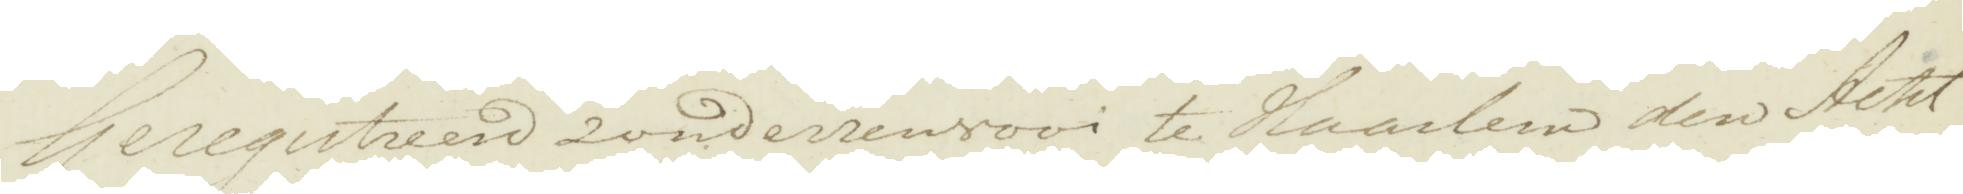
Geregistreerd zonder renvooi te Haarlem den Acht
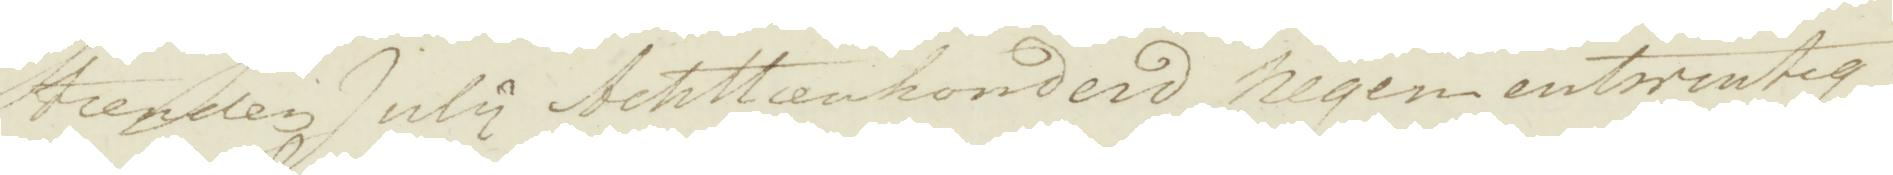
tienden Julij Achttienhonderd negen entwintig
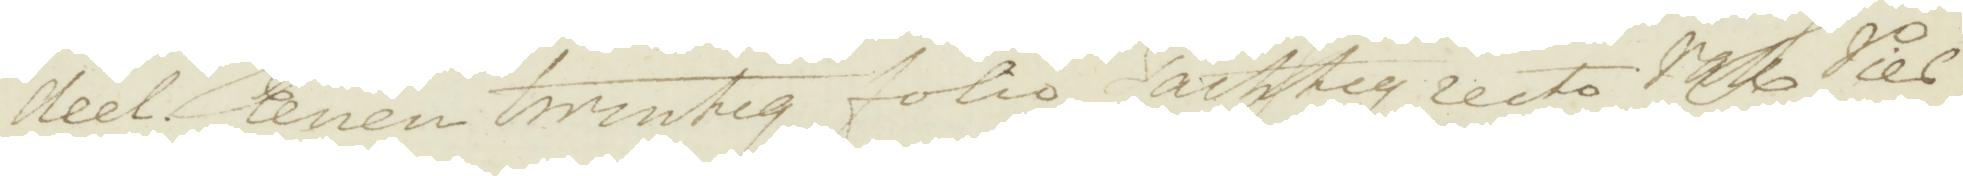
deel. Eenen twintig folio Tachtig recto Vak Vier
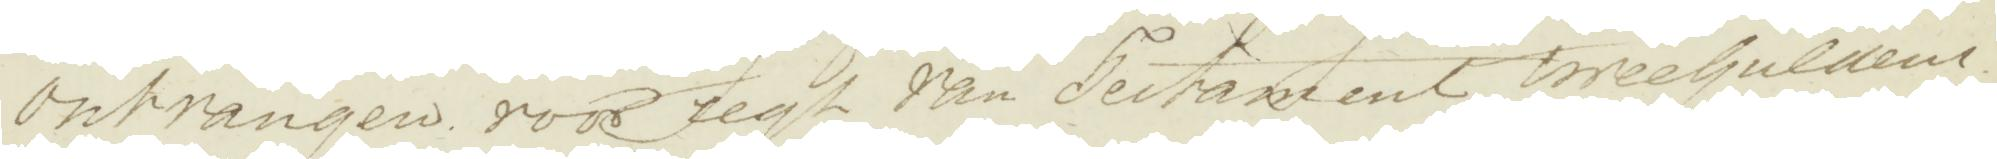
ontvangen voor regt van Testament twee Guldens
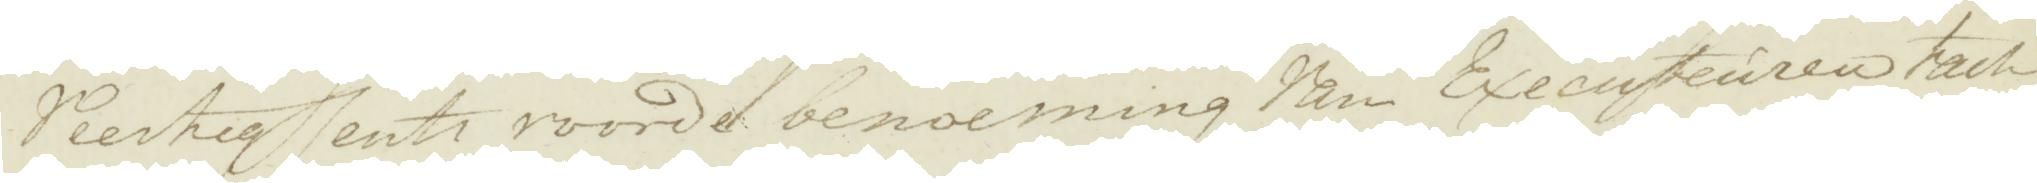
Veertig Cents voorde benoeming van Executeuren tach
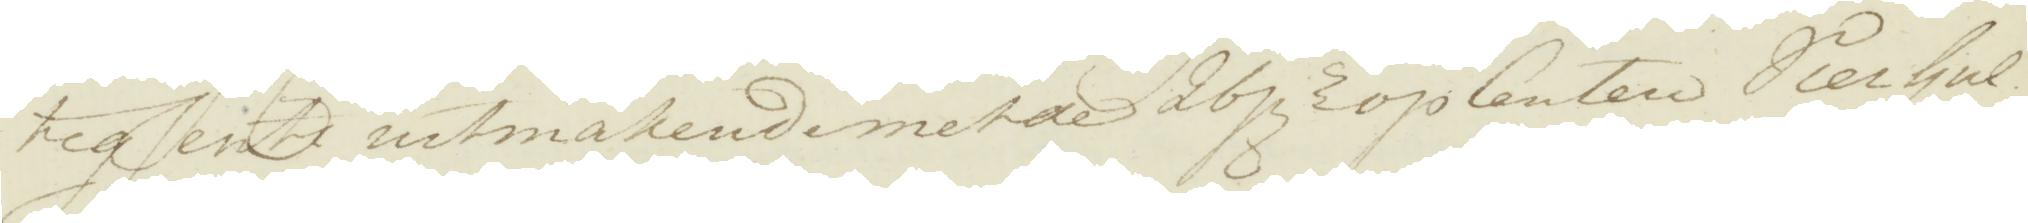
tig Cents uitmakende met de 26/c=t opCenten Vier Gul
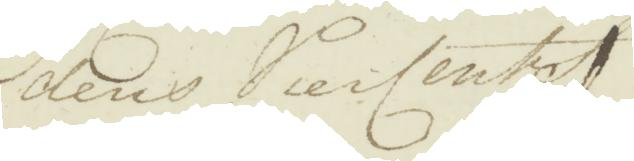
dens Vier Cents
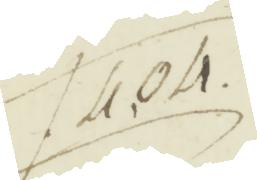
f4.04.
